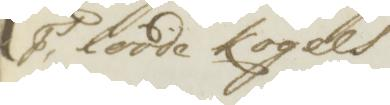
p„s loode kogels
